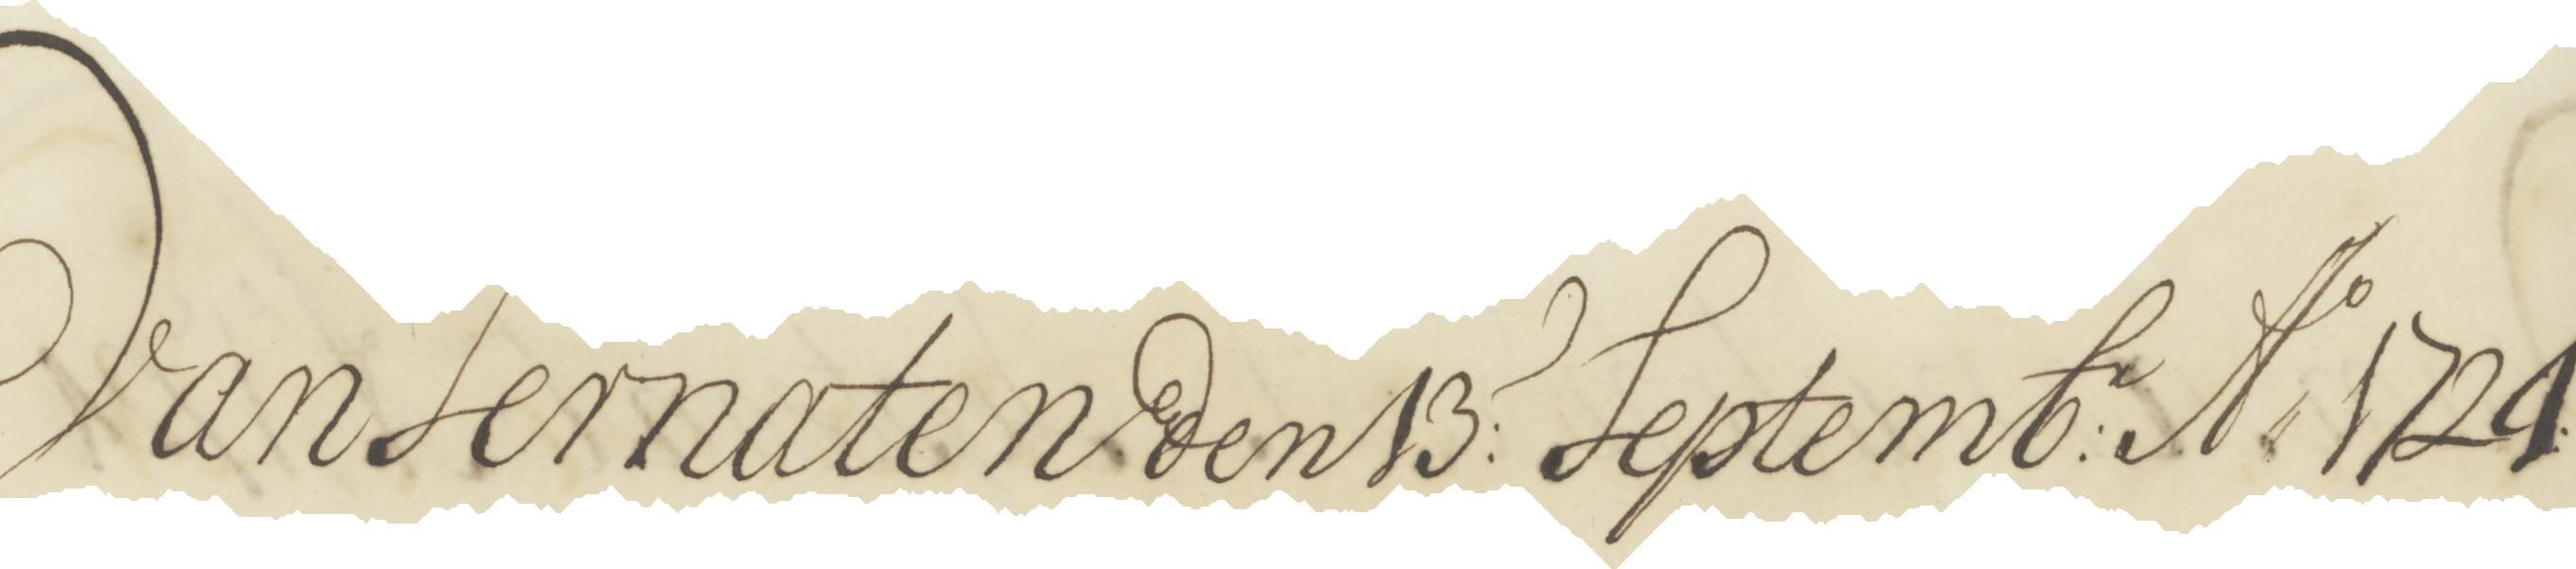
Van Ternaten den 13:' Septemb:r A:o 1724.
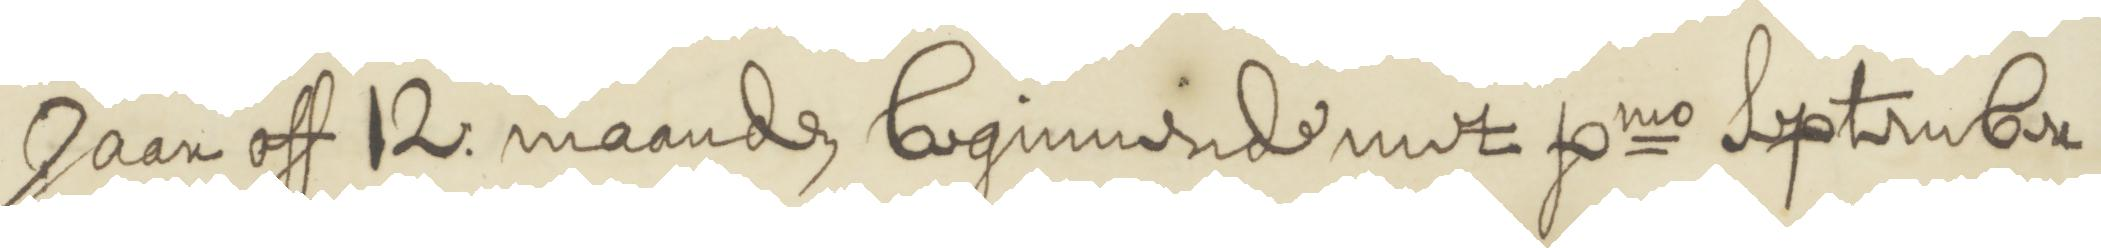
Jaar off 12: maanden beginnen de met p=mo September
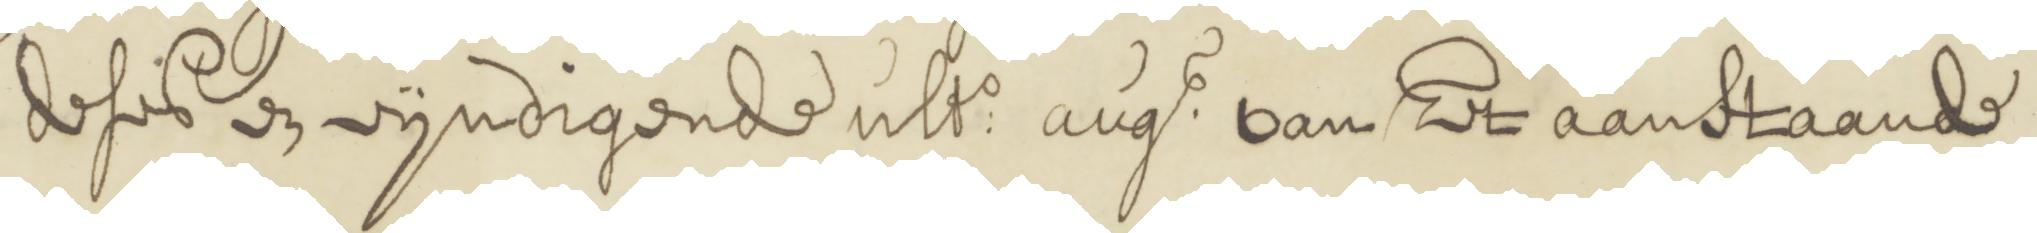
deses en eijndigende ult:o aug:s van het aanstaande
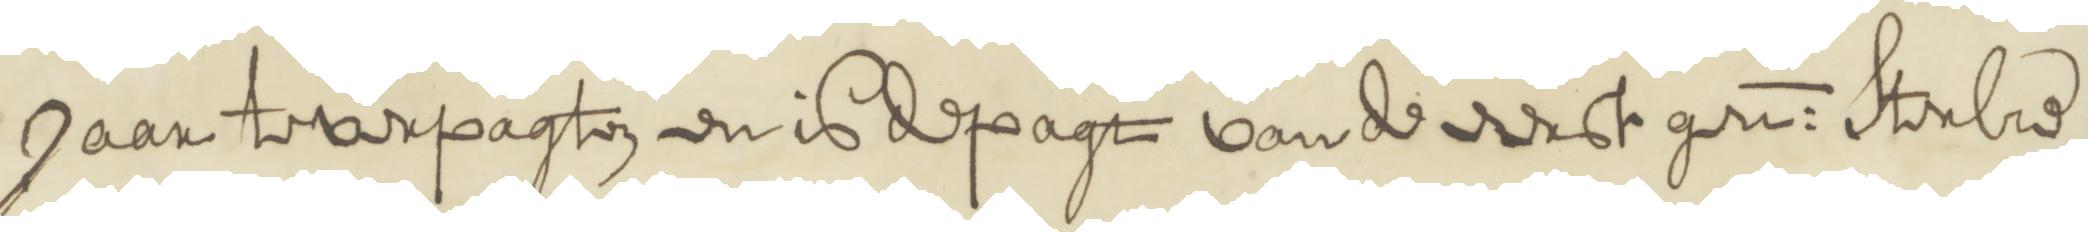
Jaar te verpagten en is de pagt van de eerst gen: Sterke
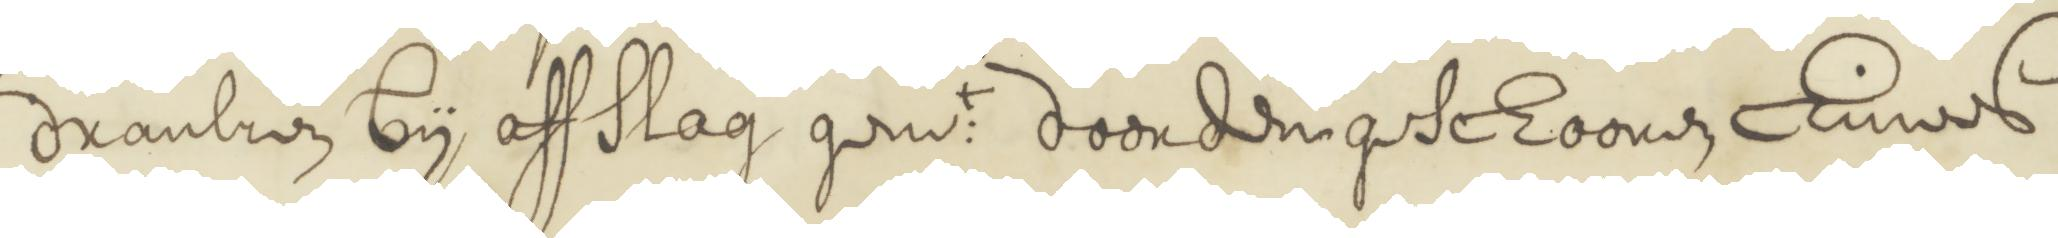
dranken bij affslag gem:t door den geschooren Chinees
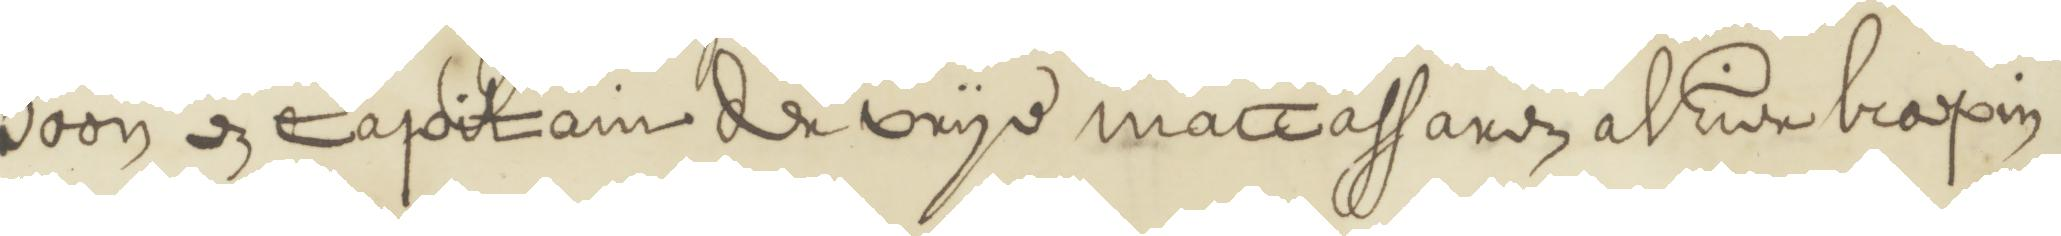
Soon en Capitain der vrije maccassaren alhier koepin
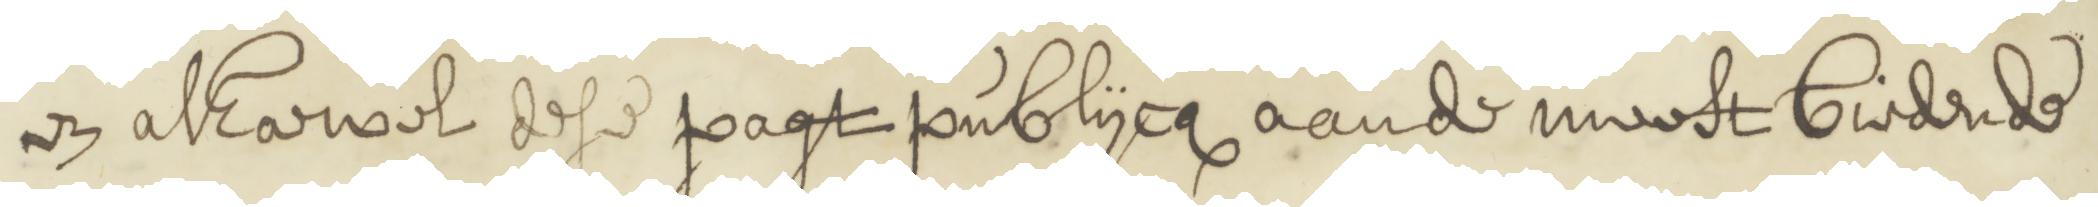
en alhoewel dese pagt publijcq aan de meest biedende
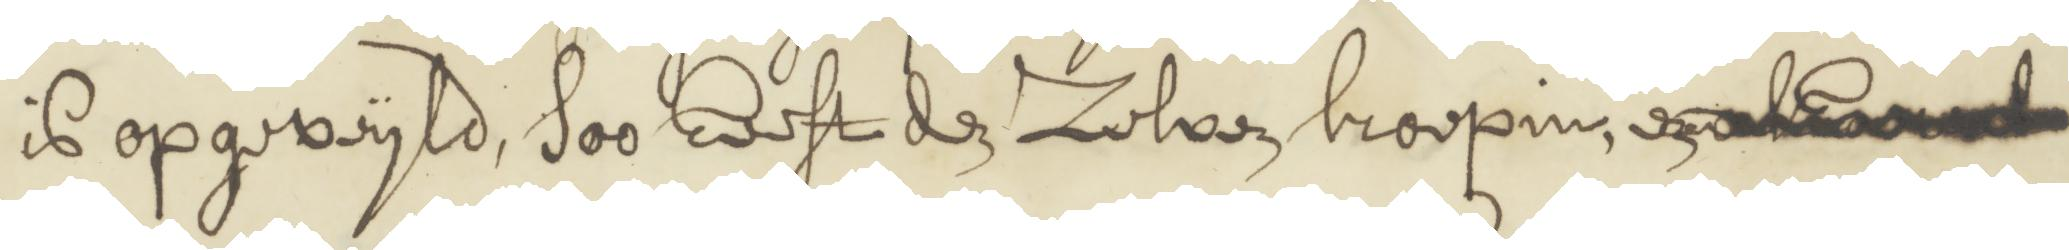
is opgeveijld, Soo heeft den zelven koepin, en alhoewel
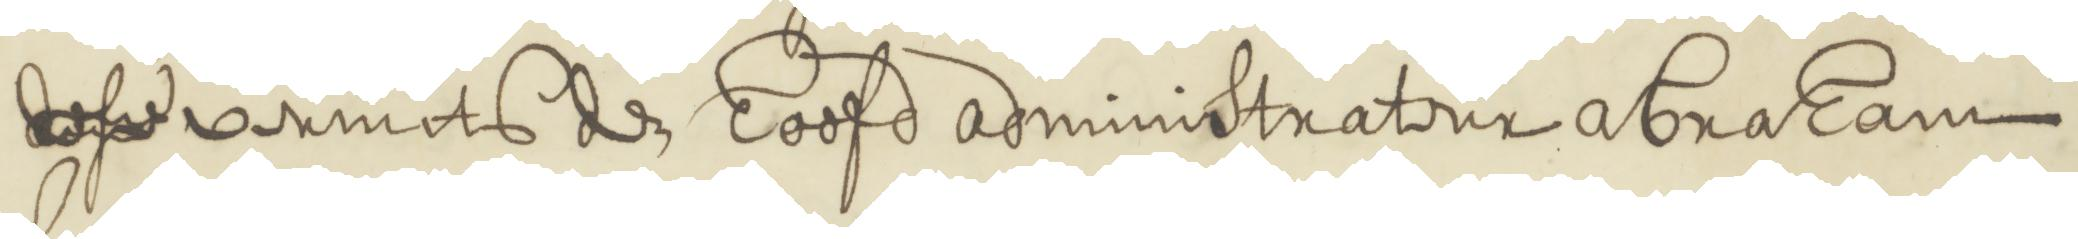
dese vermits den hoofd administrateur abraham
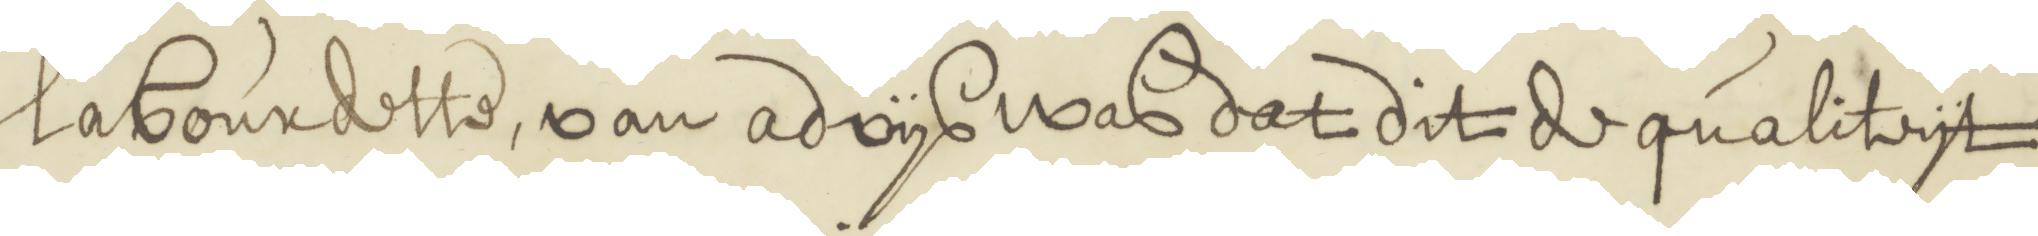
la bourdette, van advijs was dat dit de qualiteijt
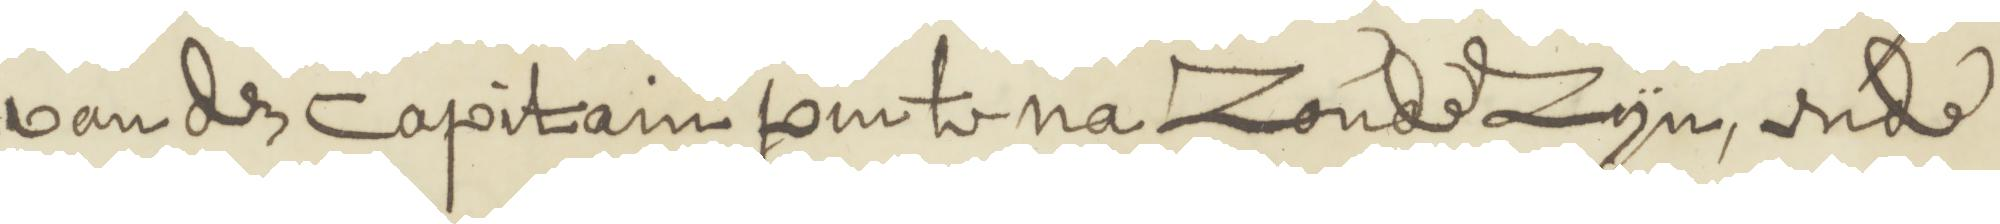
van den Capitain pin te na Zoude Zijn, ende
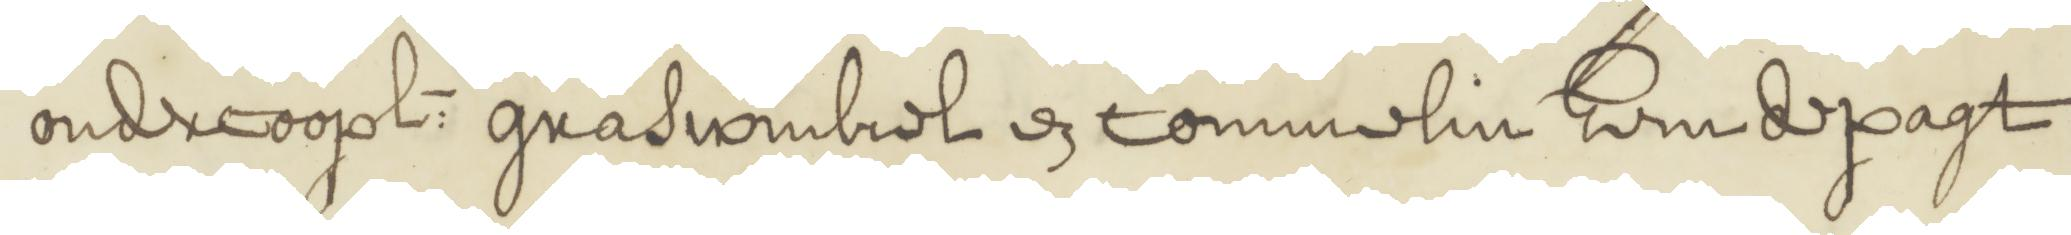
ondercoopl: graswinkel en commelin hem depagt
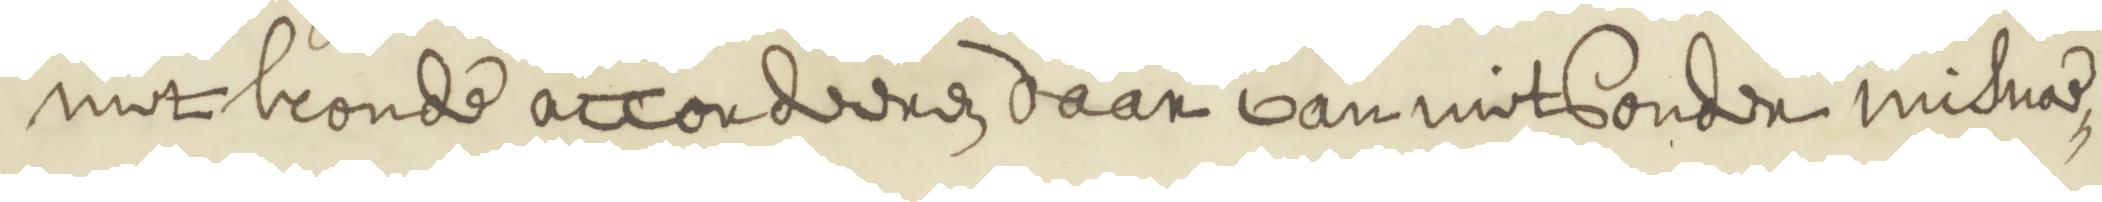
niet konde accordeeren daar van niet sonder misnoe„
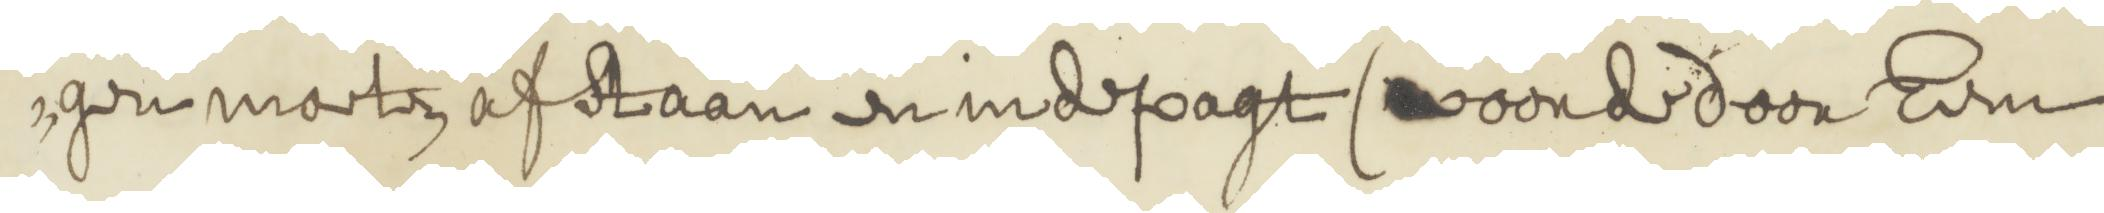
„gen moeten afstaan en in de pagt (voor de door hem
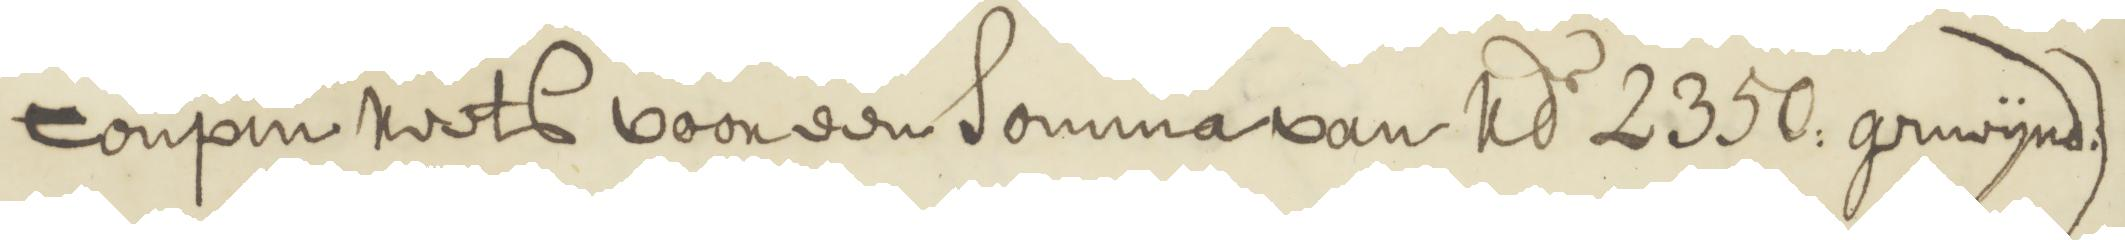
coupin reets voor een Somma van rd:s 2350: gemeijnd:)
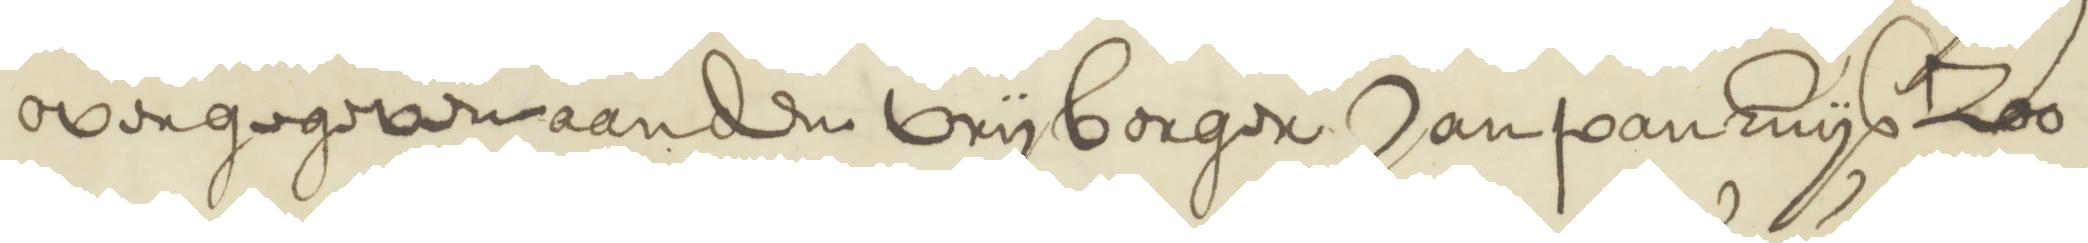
overgegeven aan den vrij borger Jan panhuijs Zoo
